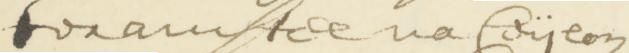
teramstel na Ceijlon
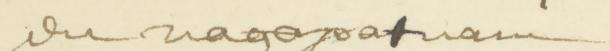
en nagapatnam
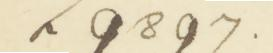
ƒ9897.
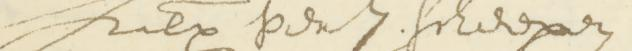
sulx per 7. scheepen
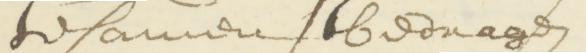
tesamen t bedragen
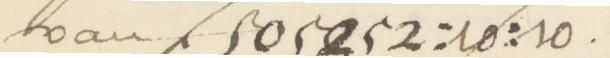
van ƒ505252:10:10.
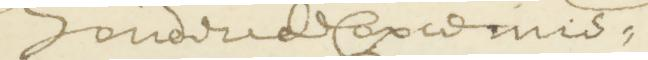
houdende Copie mis„
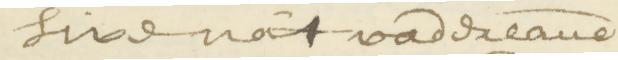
sive na 't vaderland
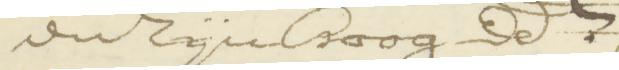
en zijn hoog Ed=l
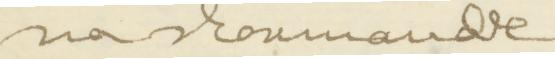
na chormandel
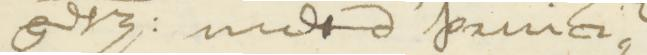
gesz: met d’ princi„
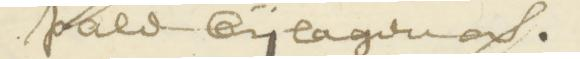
pale bijlagen over.
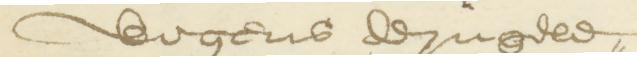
wegens de jngele„
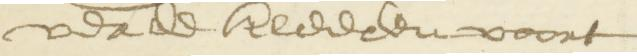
verde kleeden voort
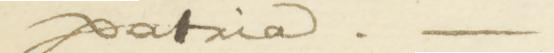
patria. —
